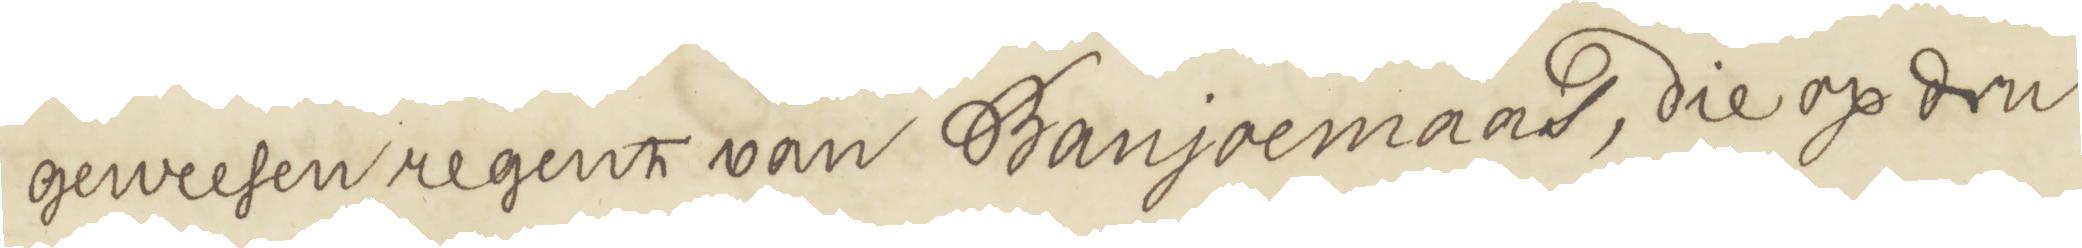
geweesen regent van Banjoemaas, die op den
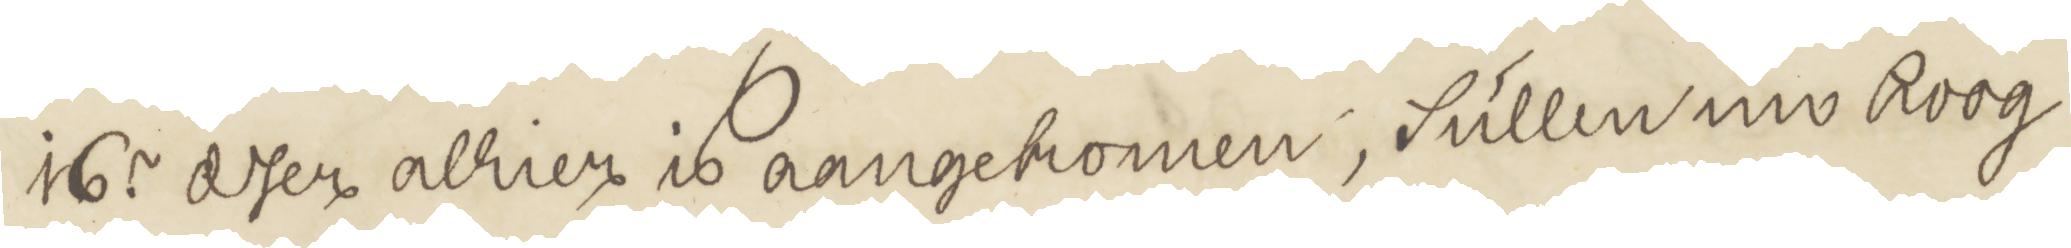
16.' deser alhier is aangekomen, sullen uw hoog
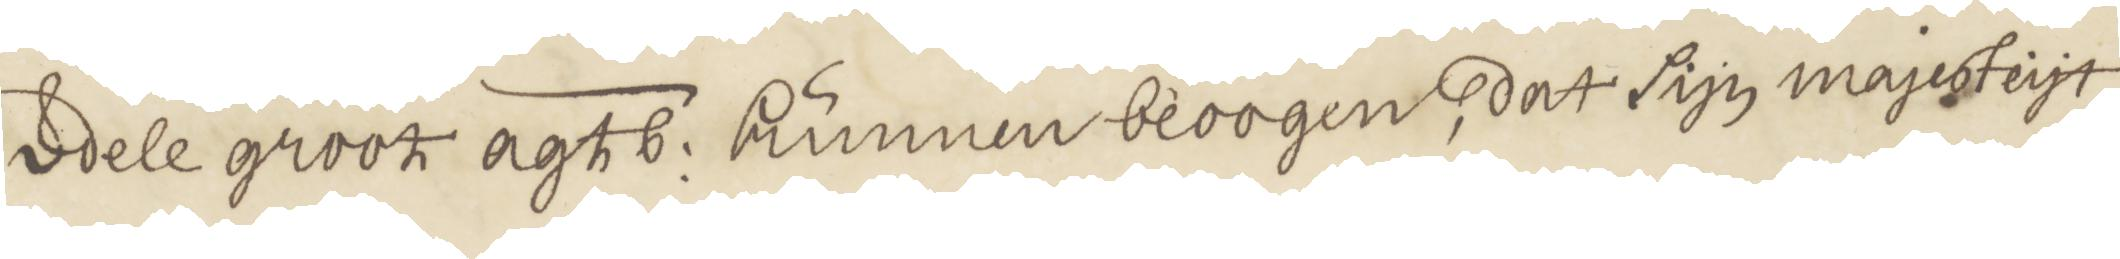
Edele groot agtb: kunnen beoogen, dat sijn majesteijt
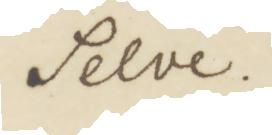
selve.
